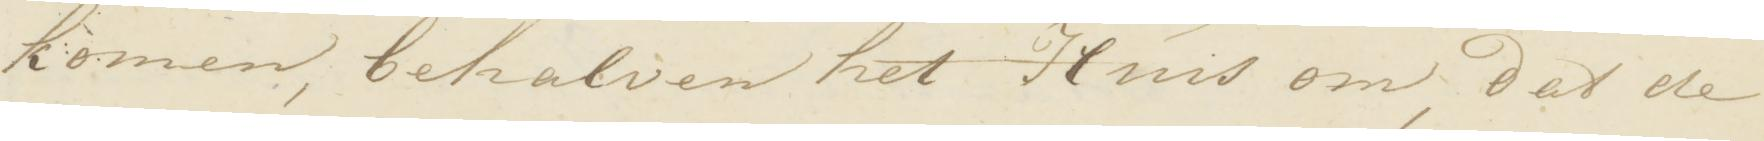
komen, behalven het Huis om, dat de
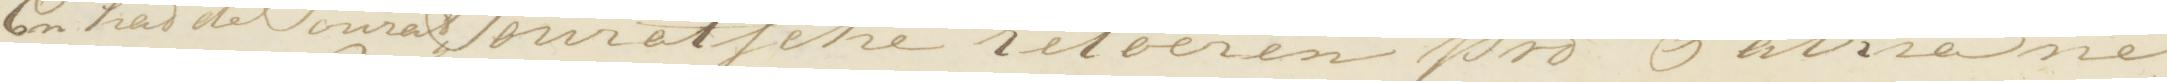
En had de Souras„ Souratsche retoeren pro Patria ne
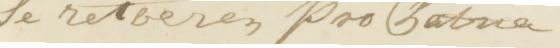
se retoeren pro Patria
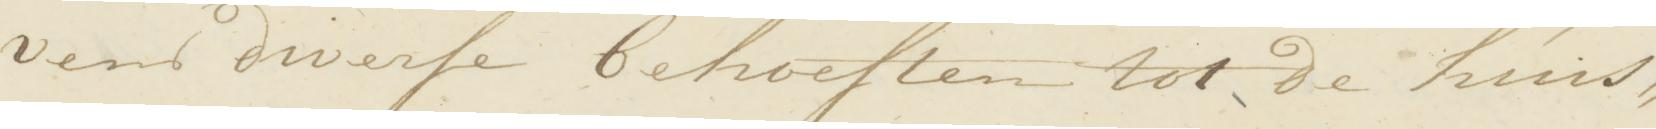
vens diverse behoeften tot de huis„
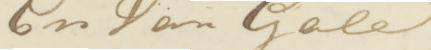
En van Gele
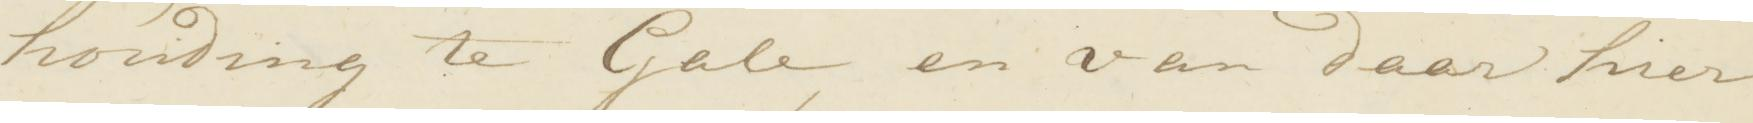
houding te Gale, en van daar hier
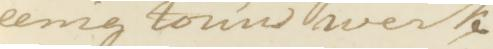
eenig touwwerk
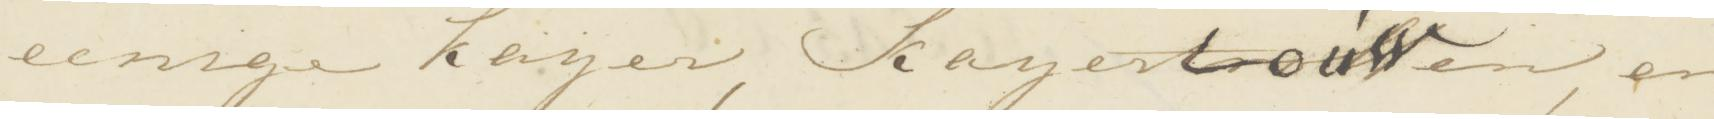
eenige kaijer, Kayertouwen, en
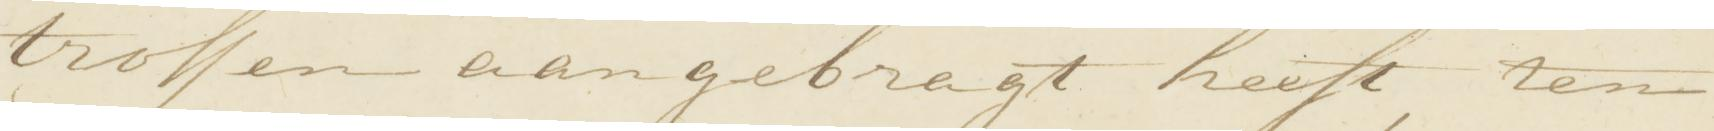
trossen aangebragt heeft, ten
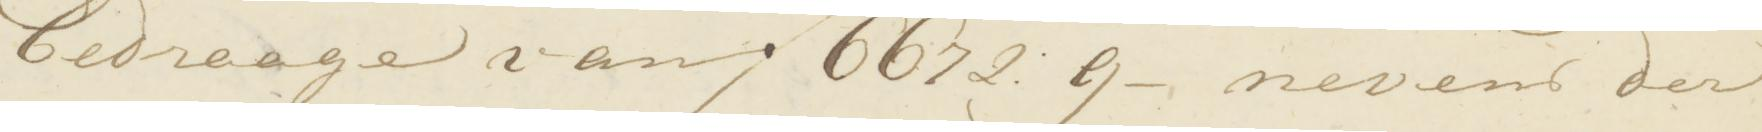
bedraage van ƒ 6672: 9 – nevens der
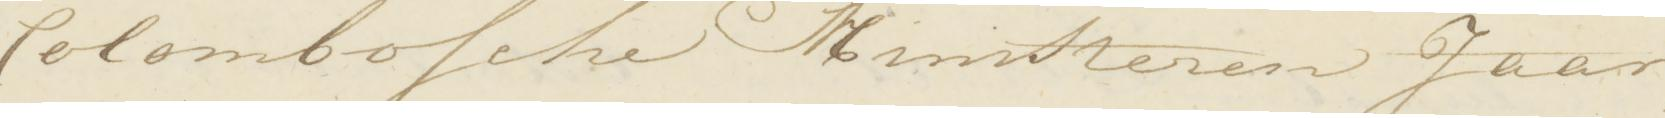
Colombosche Ministeren Jaar
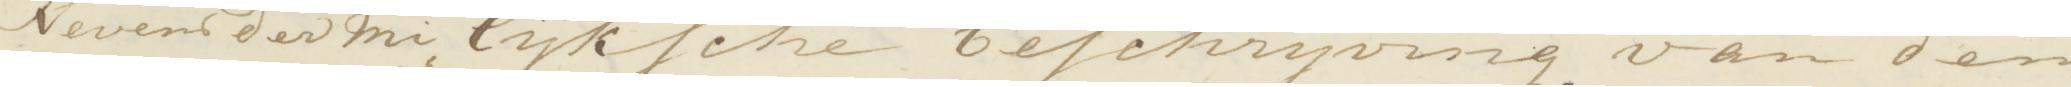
Nevens der mi„ lijksche beschrijving van den
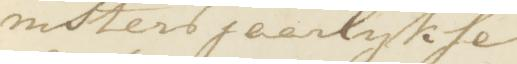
nisters jaarlykse
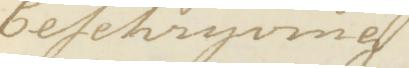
beschryving
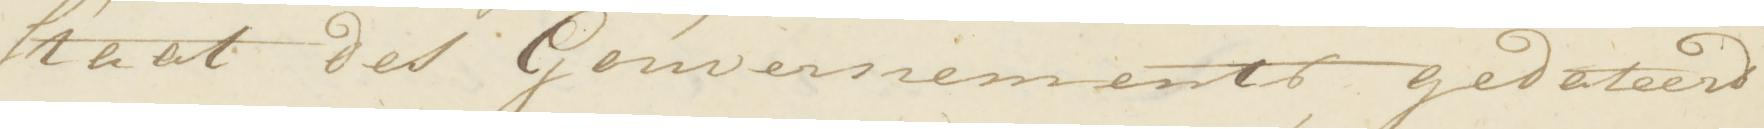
staat des Gouvernements gedateerd
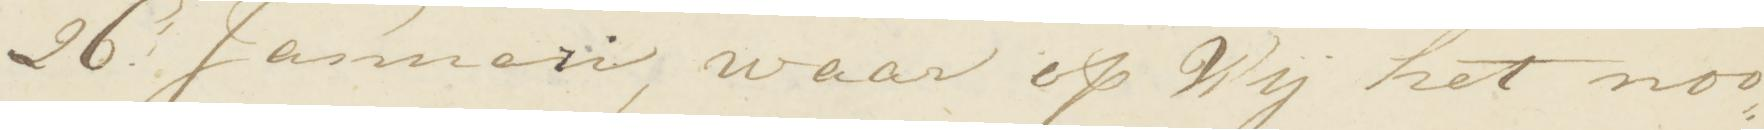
26. Januari, waar op wij het noo„
